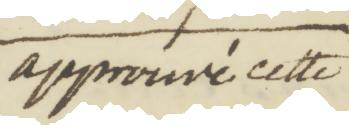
approuvé cette
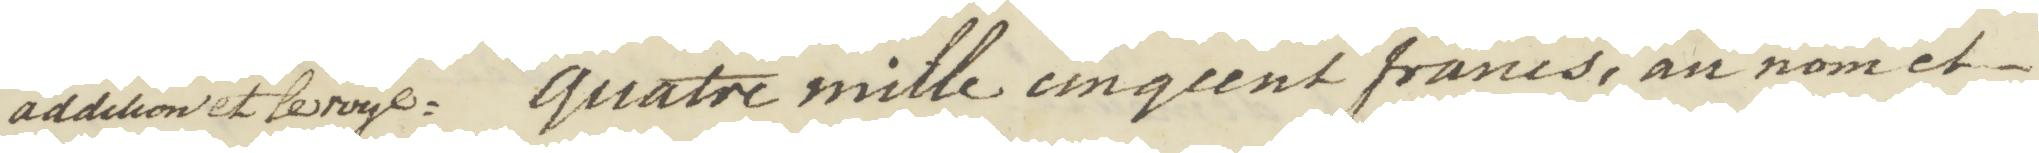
addition et le roije= Quatre mille cinqcent francs, au nom et -
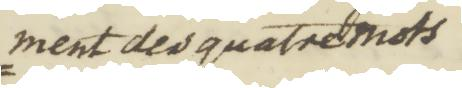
=ment des quatre mots
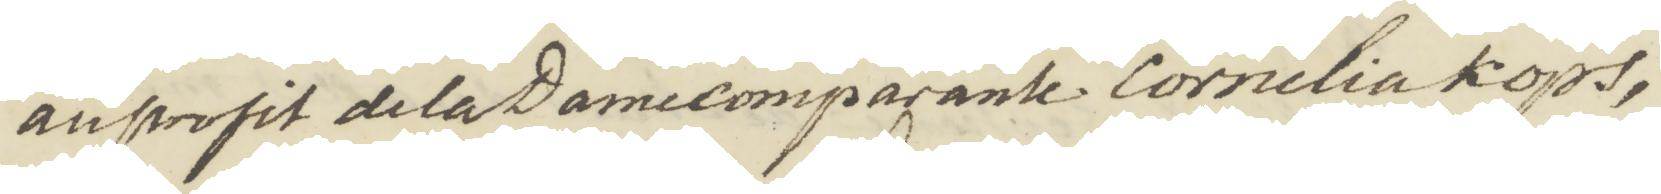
au profit de la Dame comparante Cornelia Kops,
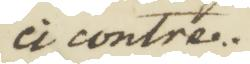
ci contre.
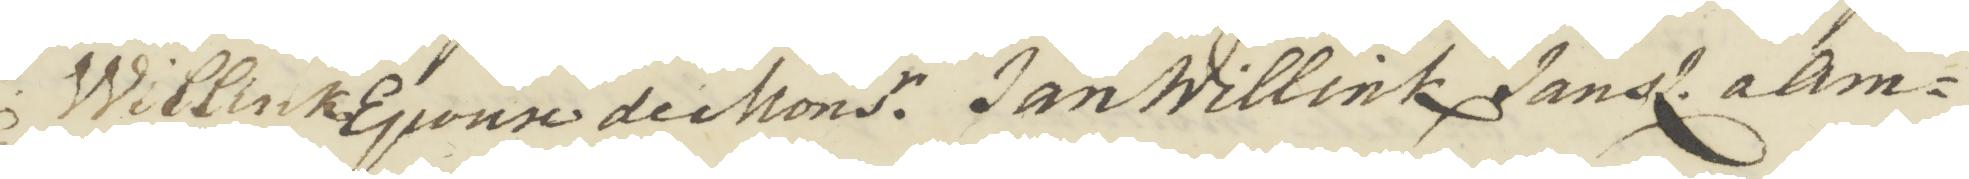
C. Willink Epour de Mons: Jan Willink Jansz. a Am=
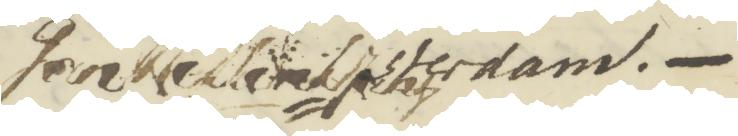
Jan Willink Jansz =sterdam. -
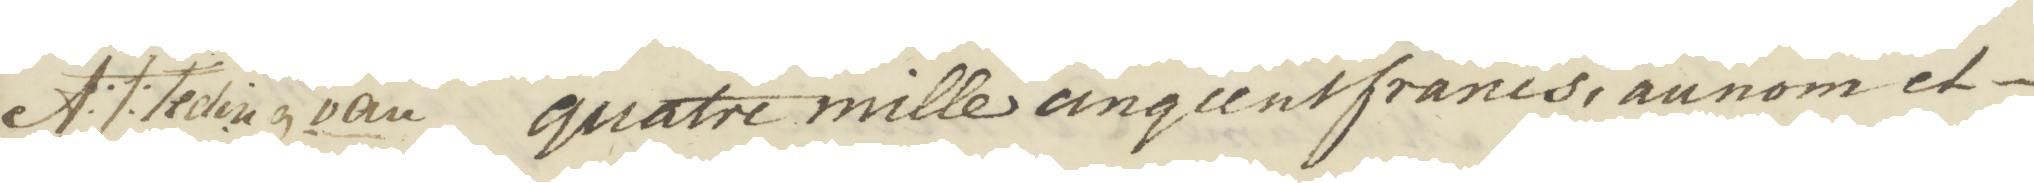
A:T:Teding van Quatre mille cinq cent francs, au nom et
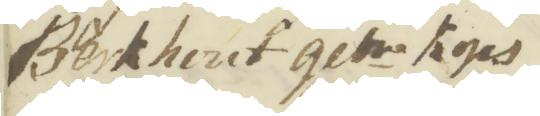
Berkhout getr-e Kops
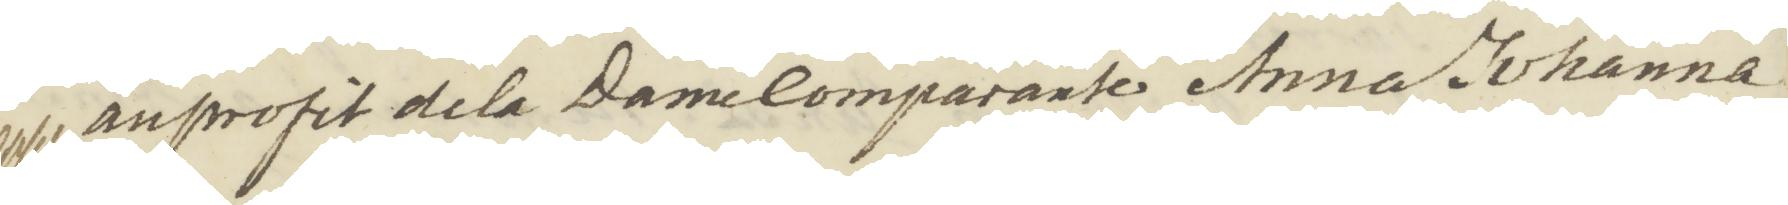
au profit de la Dame Comparante Anna Johanna
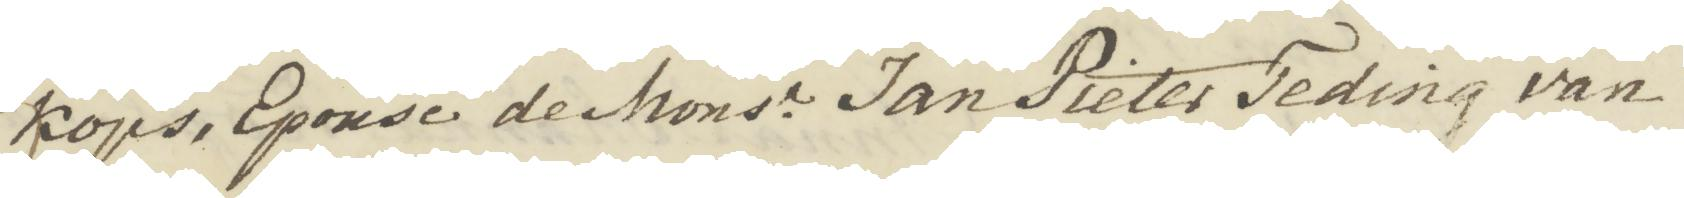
Kops, Epouse de Mons.r Jan Pieter Teding van
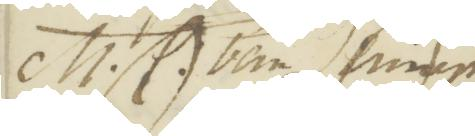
M. L: van Lennep
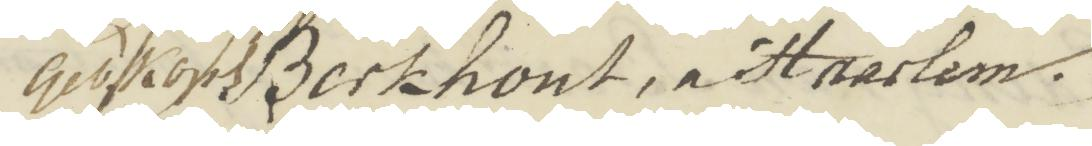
getre Kops Berkhout, a Haarlem.
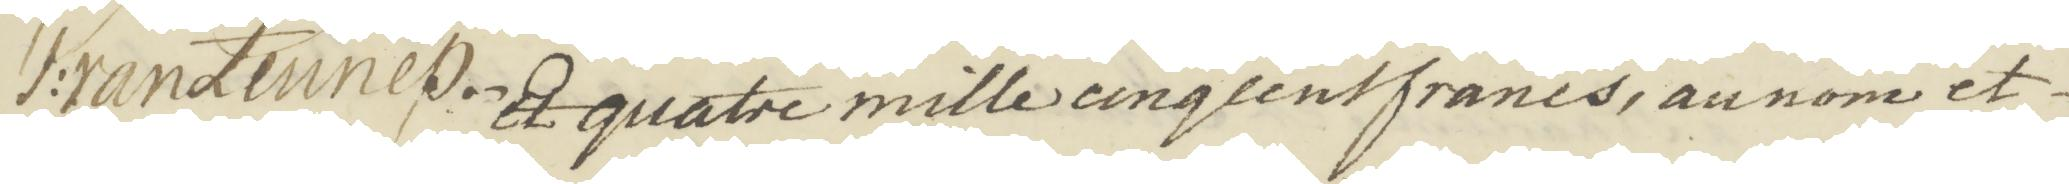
P: van Lennep Et quatre mille cinq cent francs, au nom et
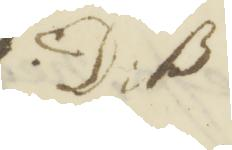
:D:B
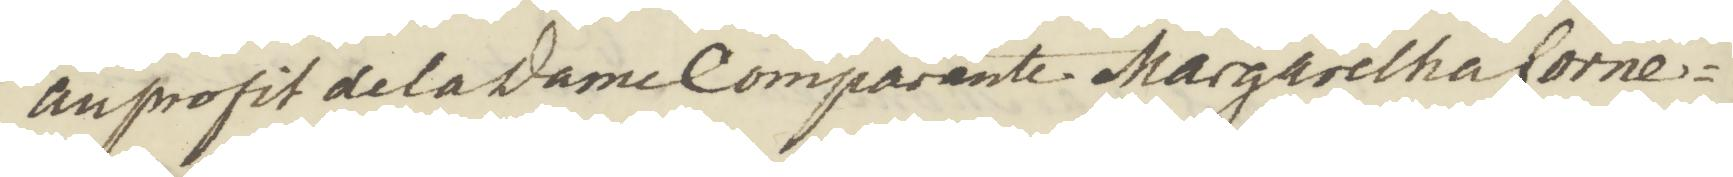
au profit de la Dame Comparante Margaretha Corne=
